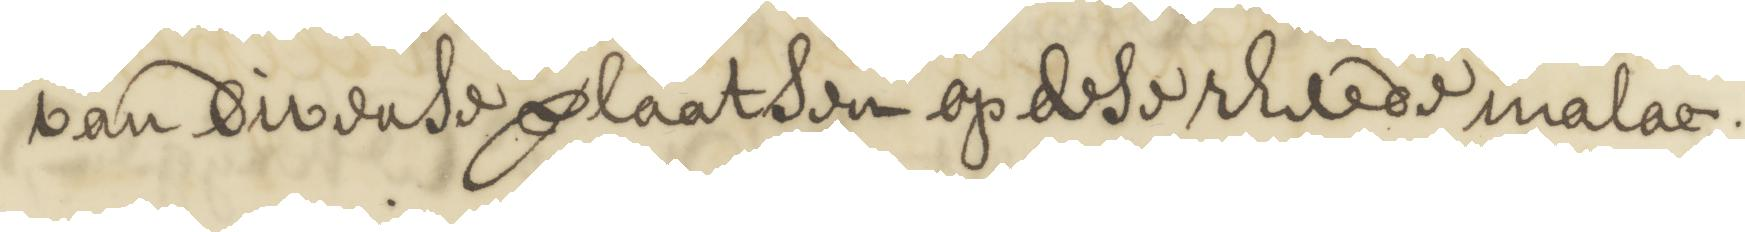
van diverse plaatsen op dese rheede malac.
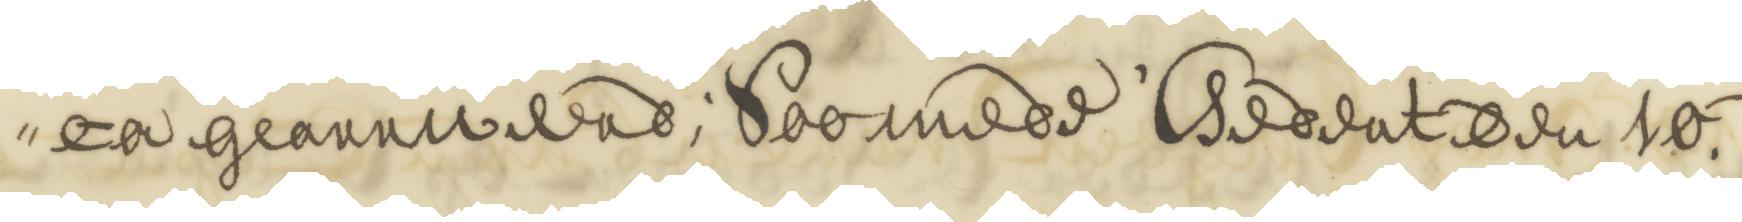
„ca gearriveerd; Soo mede 'tsedert den 10.'
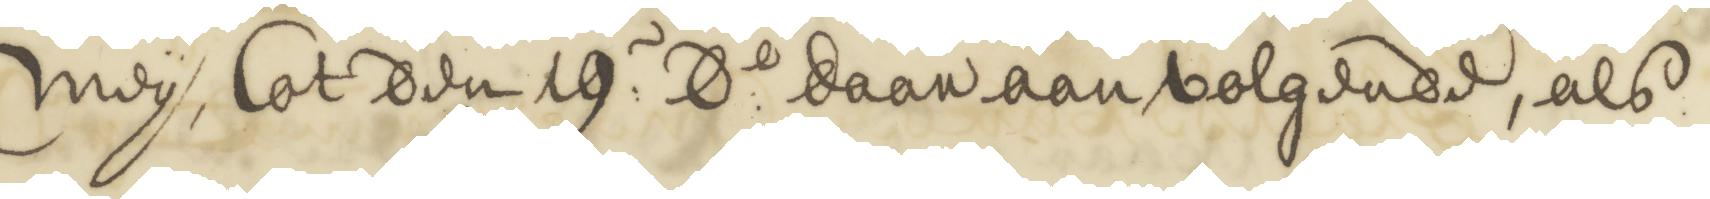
meij, tot den 19:' d:o daar aan volgende, als
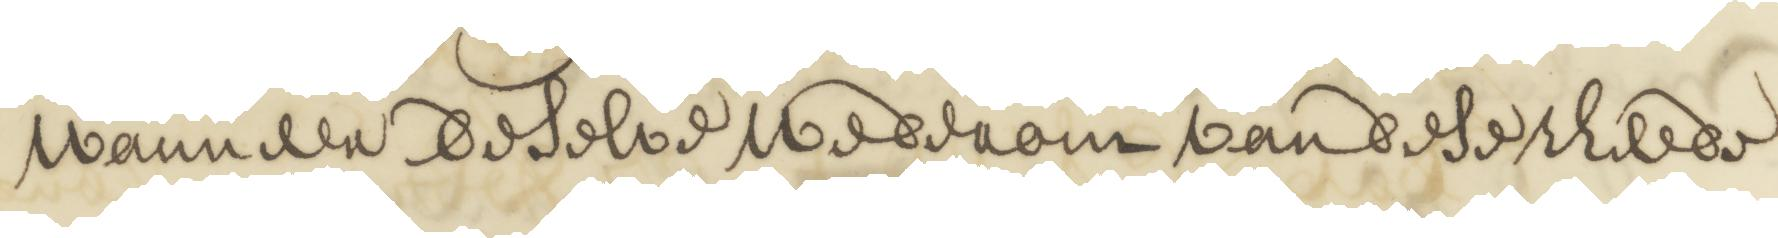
wanneer deselve wederom van dese rheede
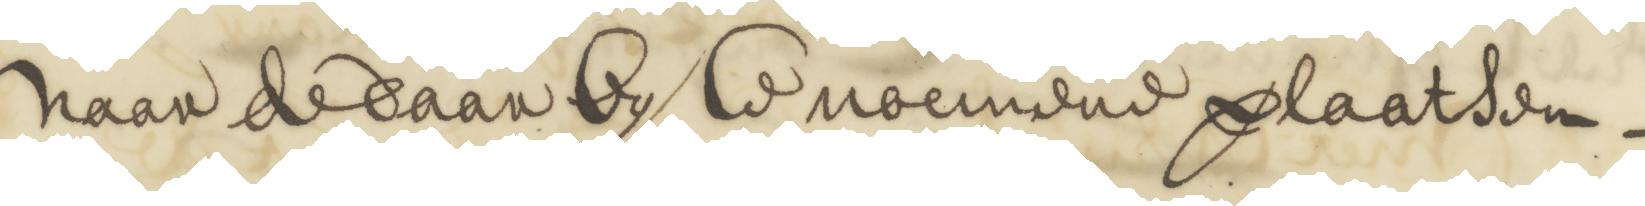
naar de daar by te noemene plaatsen
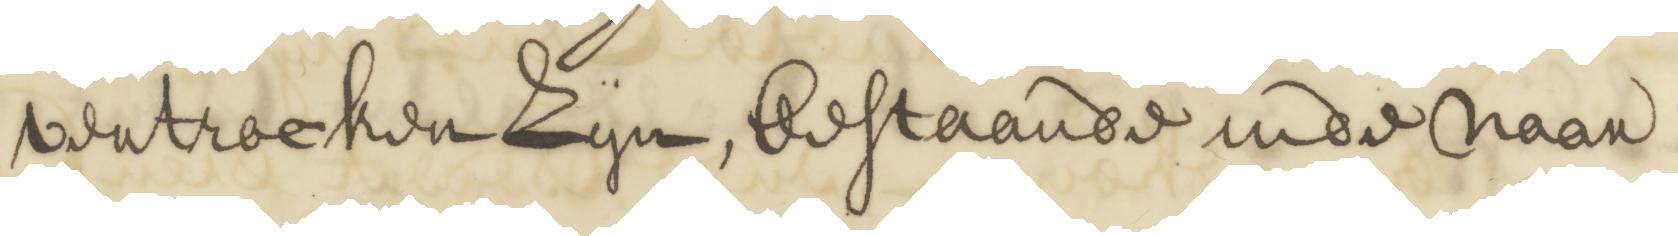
vertrocken zijn, bestaande inde naar
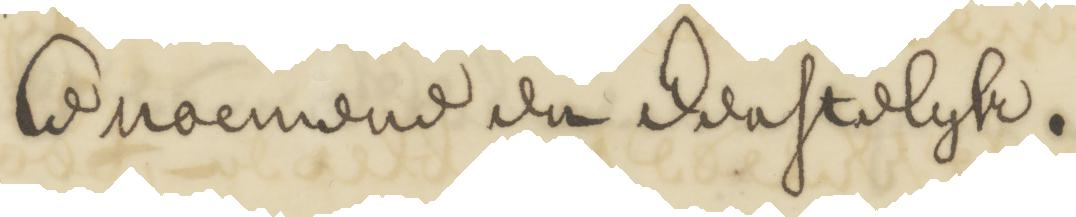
te noemene en Eerstelyk.
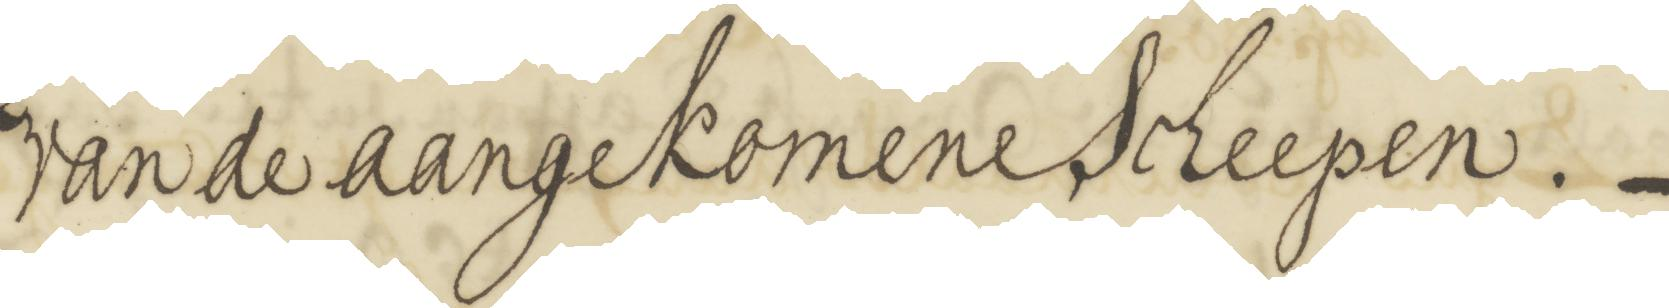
van de aangekomene scheepen.
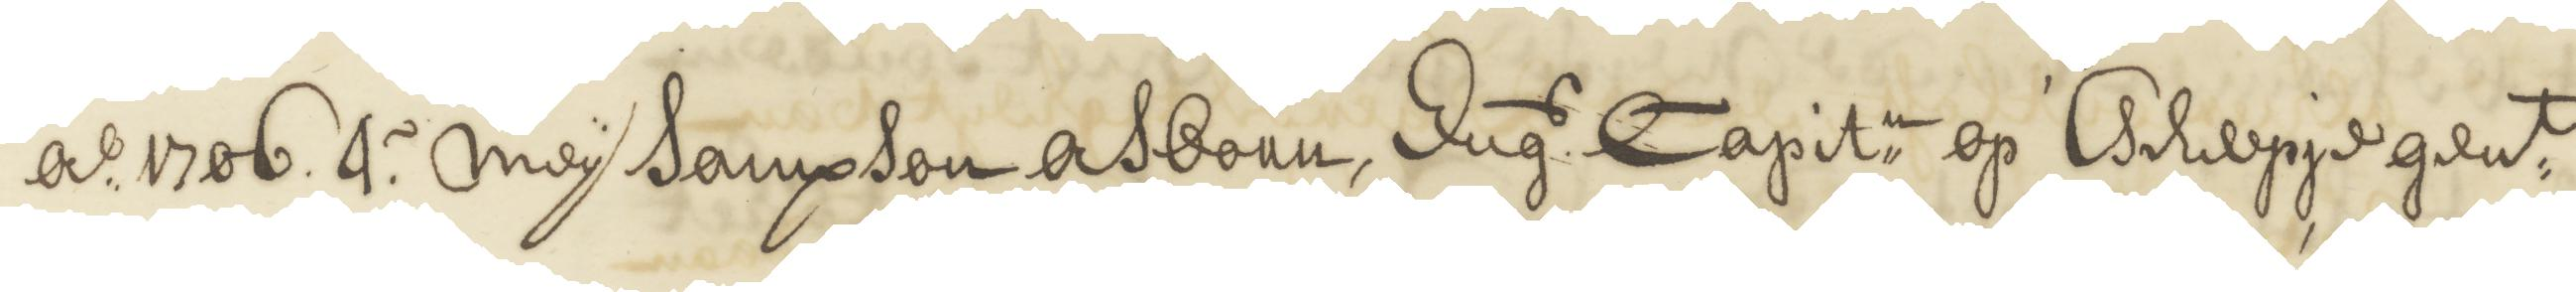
a„o 1706. 4.' meij sampson asborn, Eng:s Capit„n op ’tscheepje gen„t
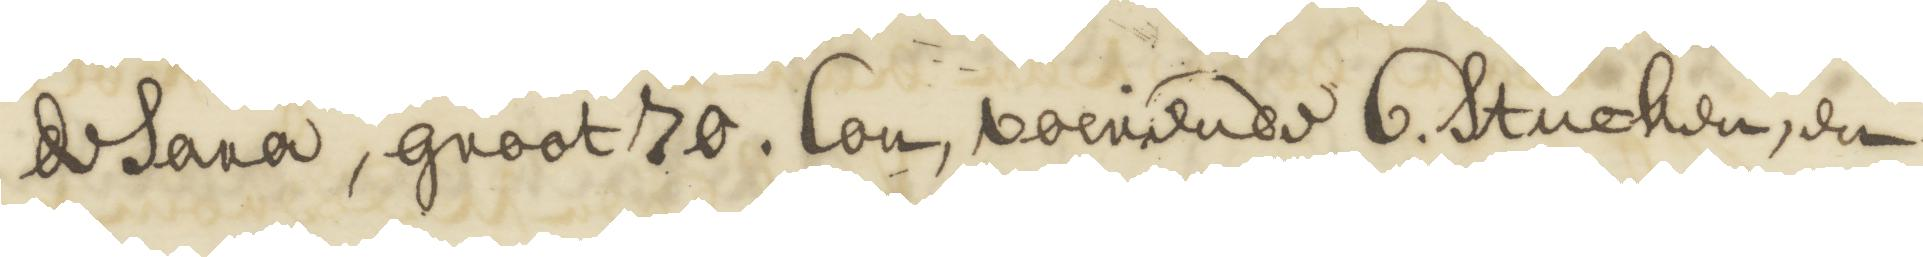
de sara, groot 70. ton, voerende 6. stucken, en
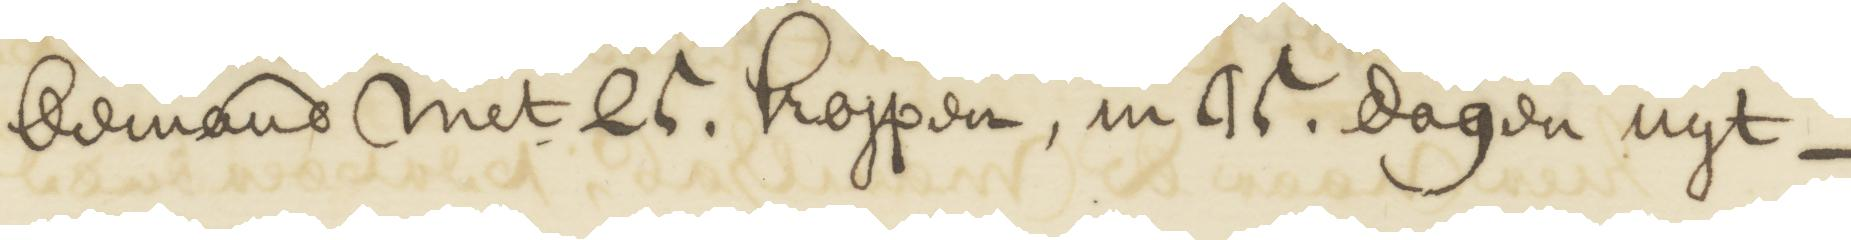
bemand met 25. koppen, in 45. dagen uyt
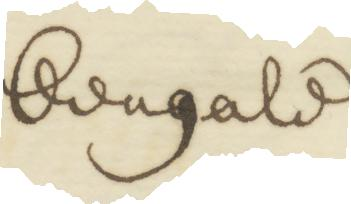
bengale
